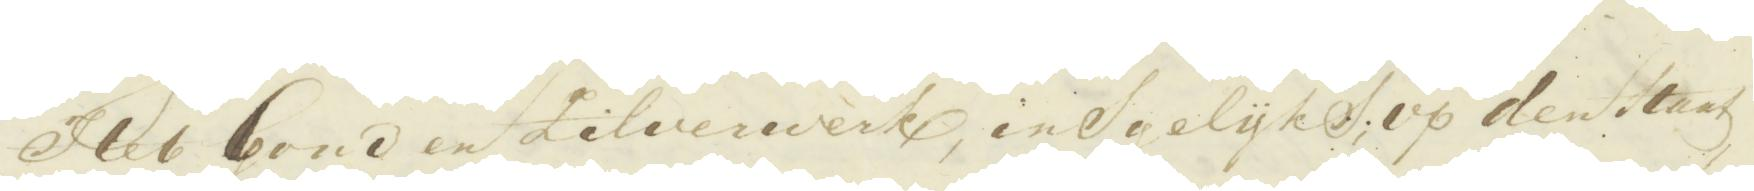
Het Goud en Zilverwerk, insgelijks, op den staat
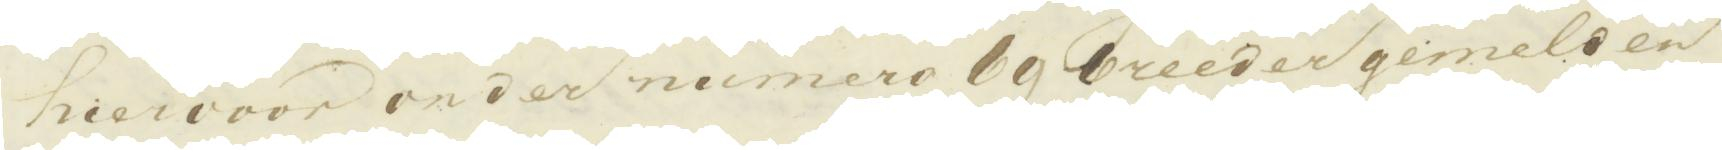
hiervoor onder numero 69 breeder gemeld en
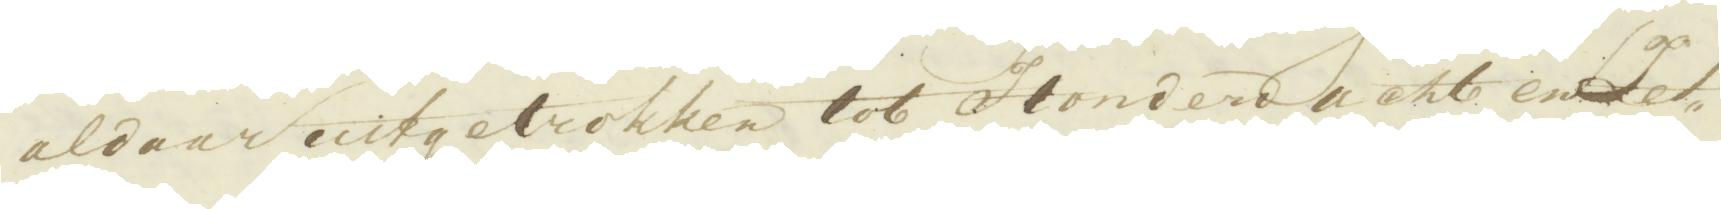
aldaar uitgetrokken tot Honderd acht en Zes„
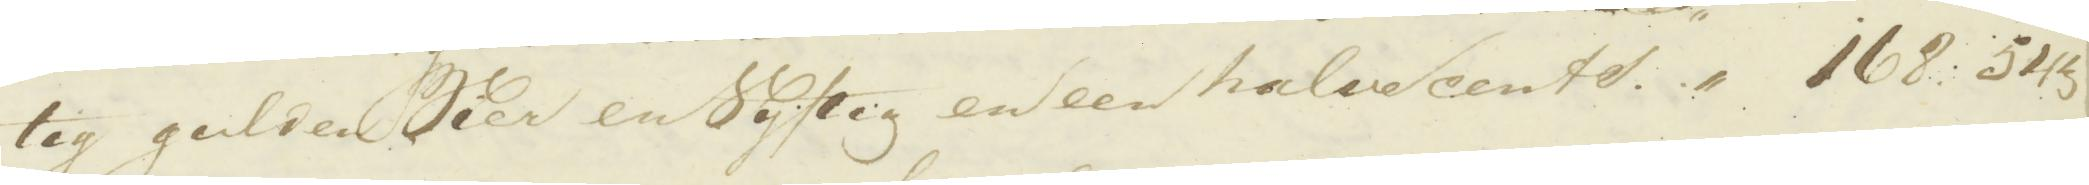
tig gulden Vier en Vijftig en een halve cents. . „ 168:54½
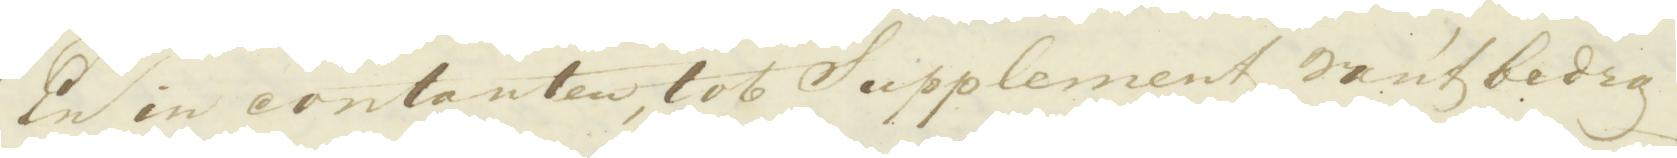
En in contanten, tot supplement van ’t bedrg
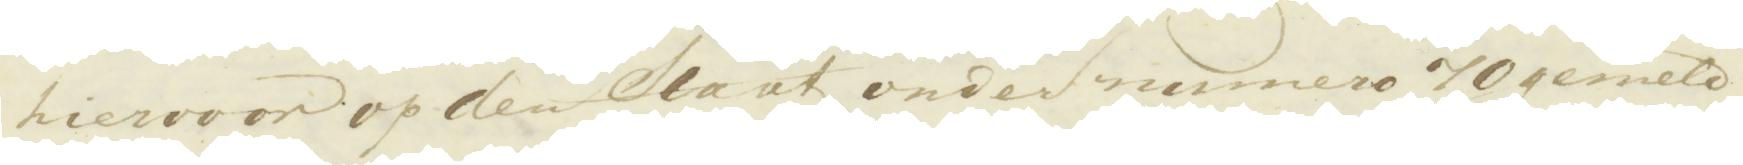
hiervoor op den staat onder numero 70 gemeld
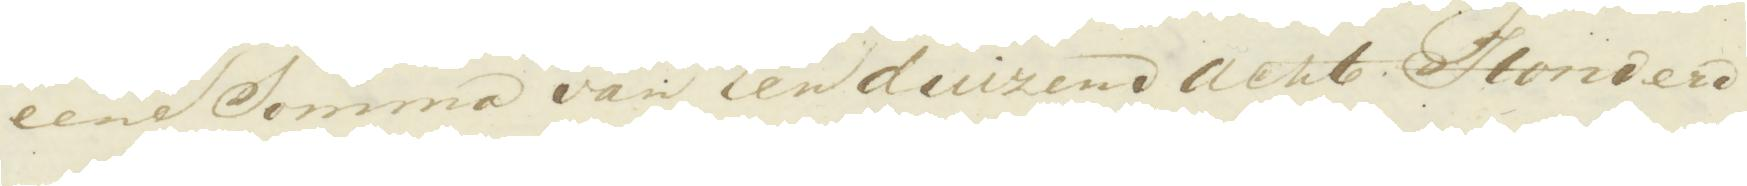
eene somma van Een duizend acht Honderd
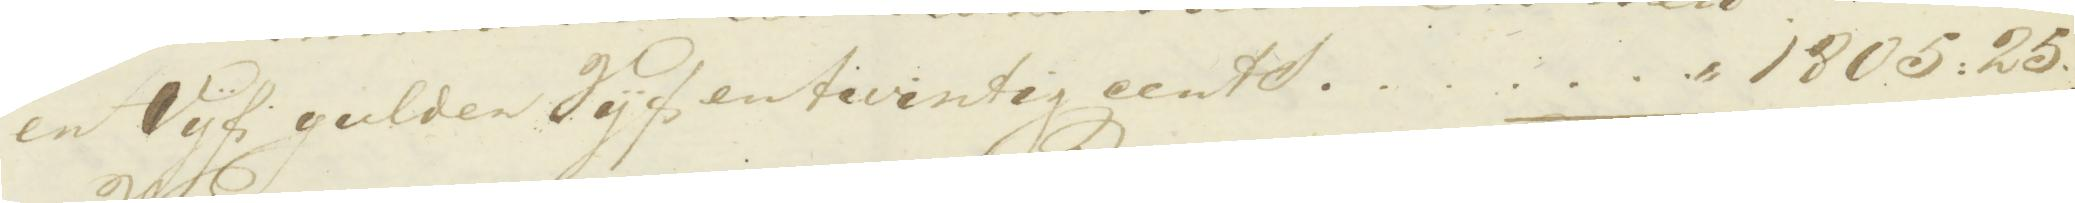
en Vijf gulden Vijf en twintig cents . . . . . . . „ 1805:25.
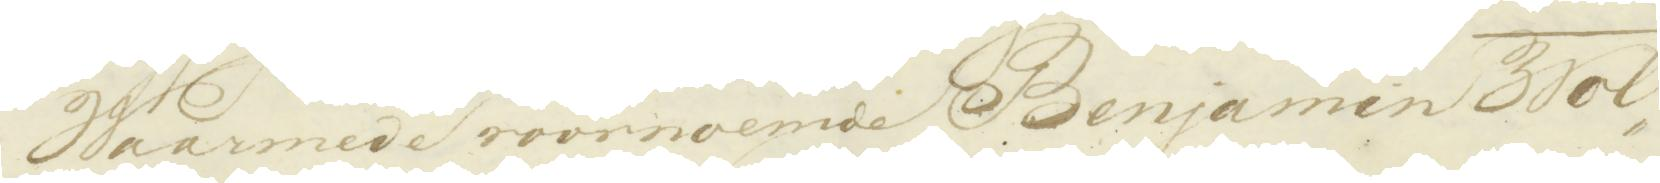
Waarmede voornoemde Benjamin Wol„
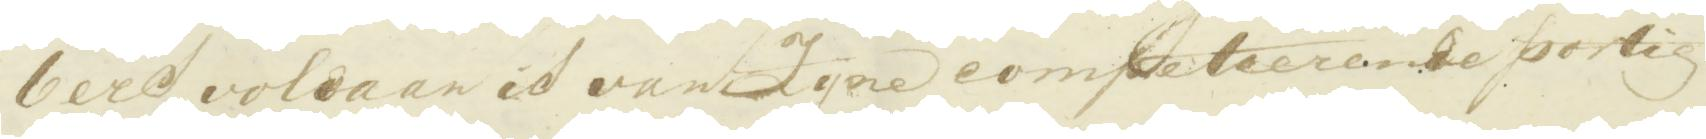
bers, voldaan is van zijne competeerende portie
